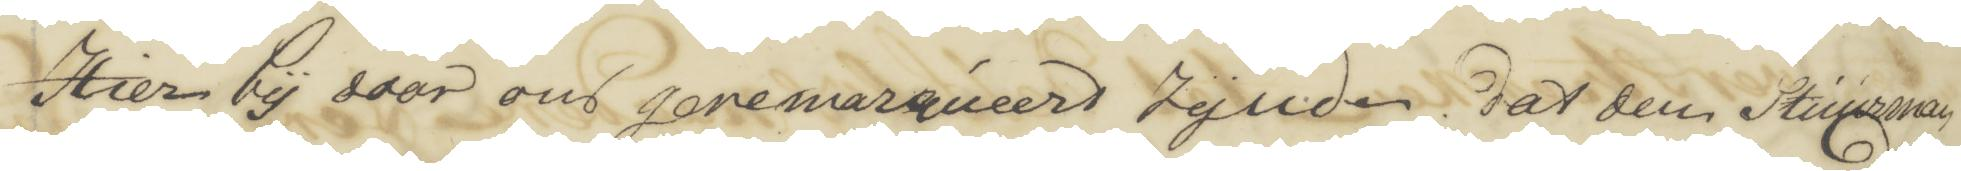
Hier bij door ons geremarqueerd zijnde dat den stuurman
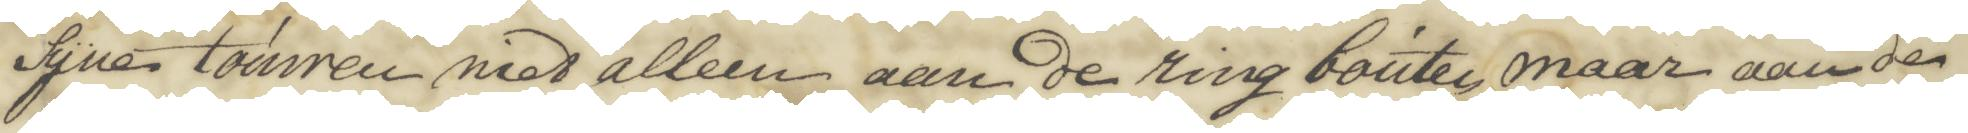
sijne touwen niet alleen aan de ring bouten maar aan de
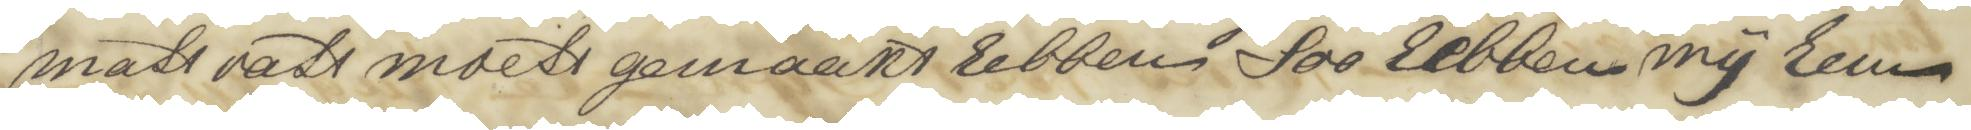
mast vast moest gemaakt hebben soo hebben wij hem
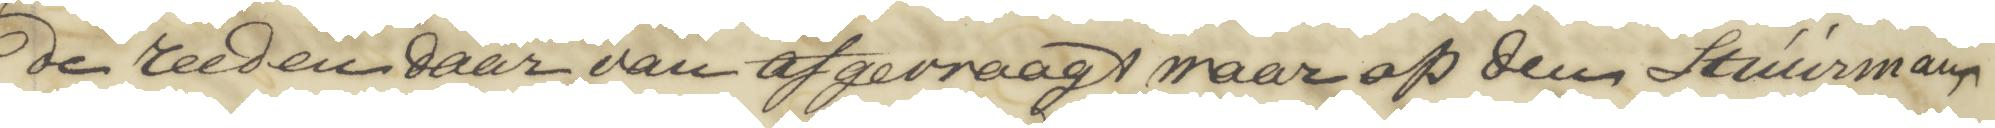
de reeden daar van afgevraagt waar op den stuurman
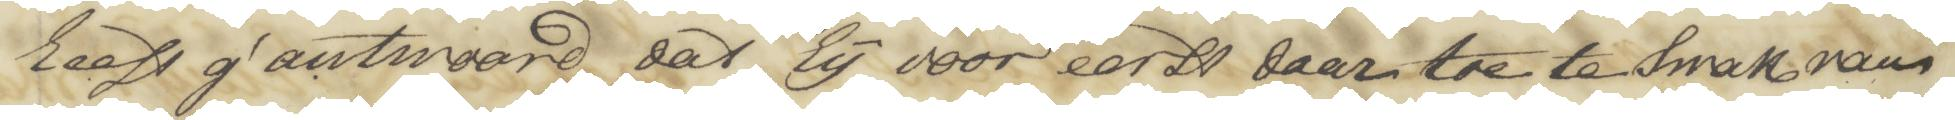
heeft g’antwoord dat hij voor eerst daar toe te swak van
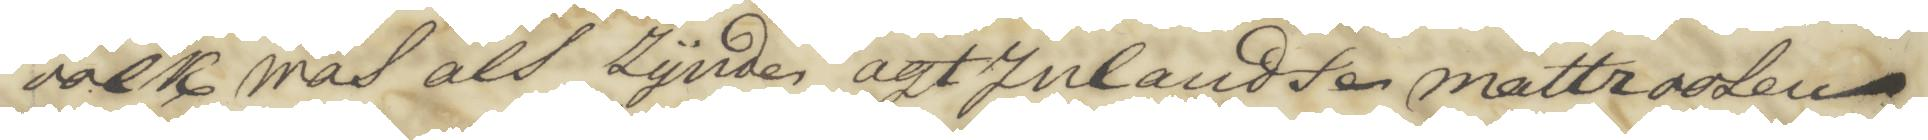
volk was als zijnde agt Jnlandse mattroosen
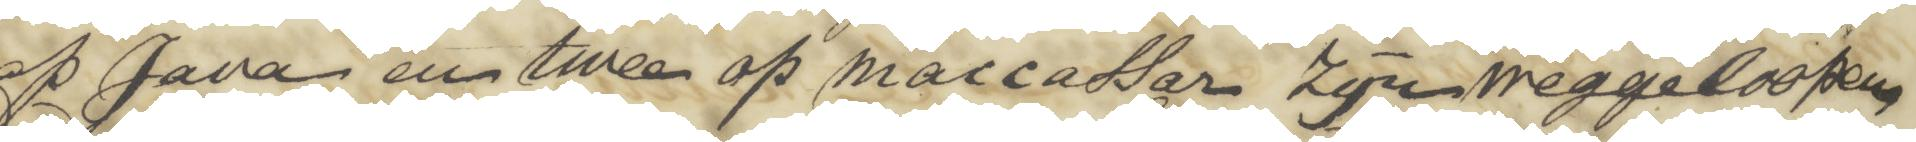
op Java en twee op maccassar zijn weggeloopen
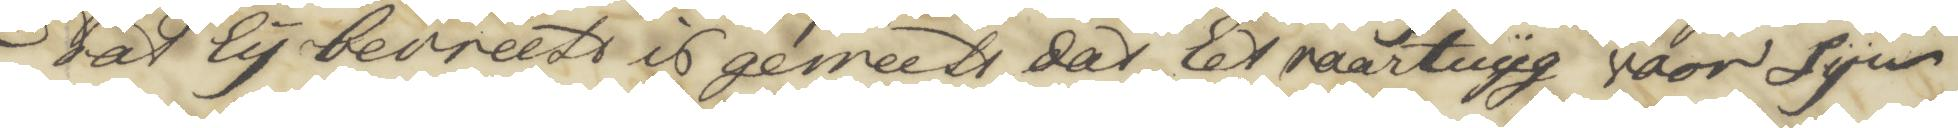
dat hij bevreest is geweest dat het vaartuijg voor sijn
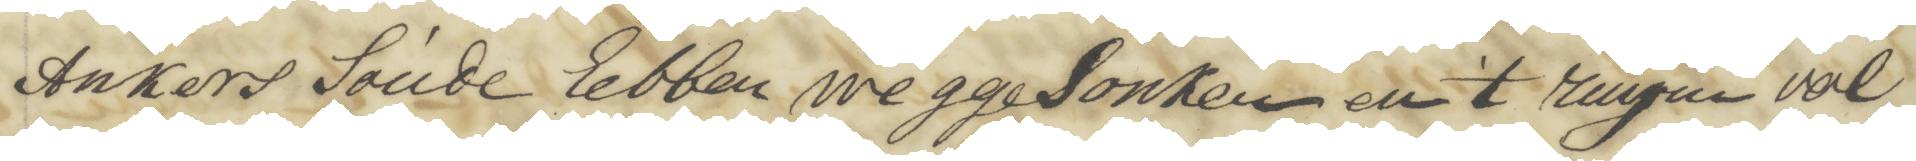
Ankers soude hebben weggesonken en ’t ruijm vol
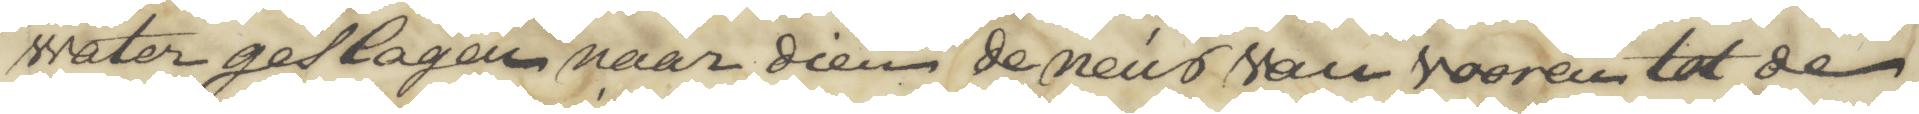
water geslagen naar dien de neus van vooren tot de
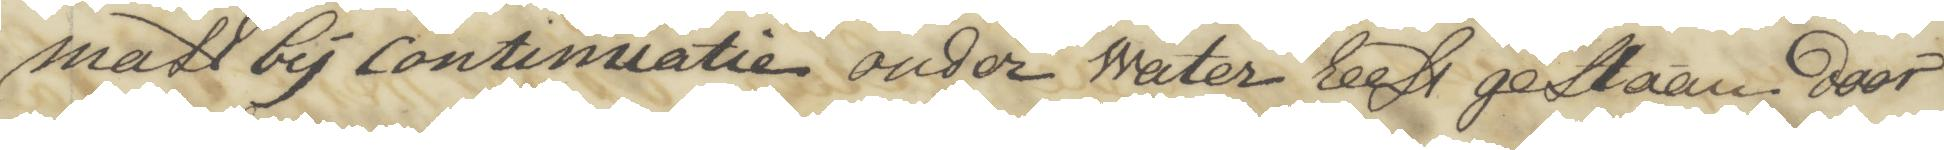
mast bij continuatie onder water heeft gestaan door
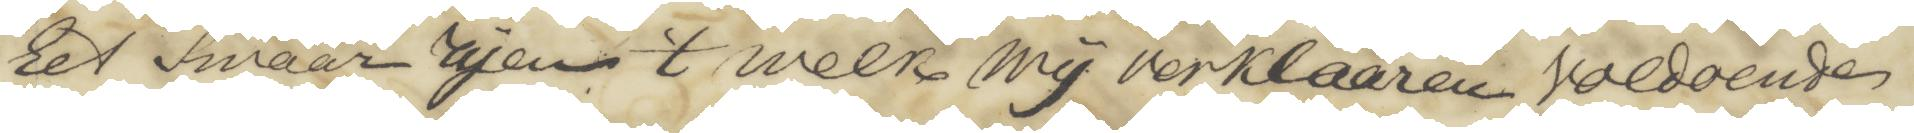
het swaar rijen ’t welk wij verklaaren voldoende
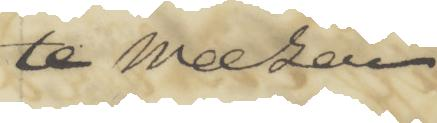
te weezen
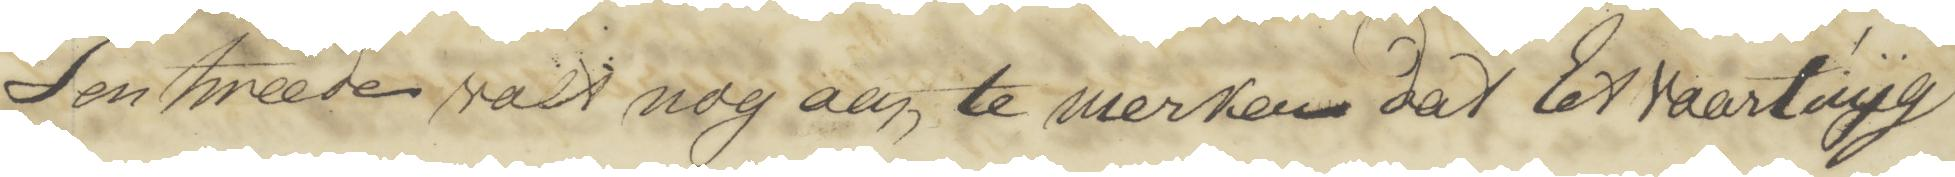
Ten tweede valt nog aan te merken dat het vaartuijg
